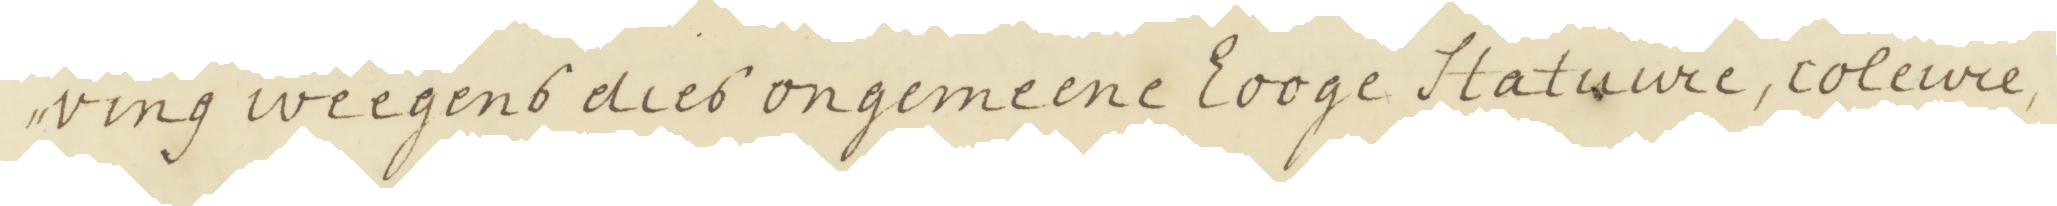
„ving weegens dies ongemeene hooge statuure, coleure,
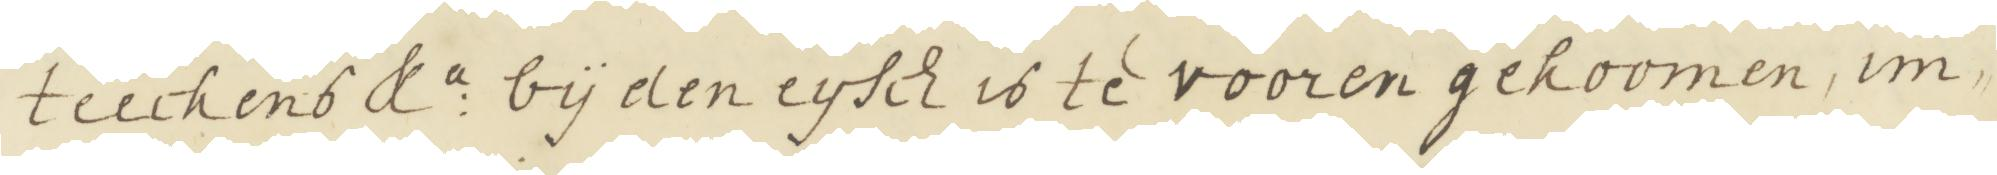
teeckens &:a bij den eijsch is te vooren gekoomen, im„
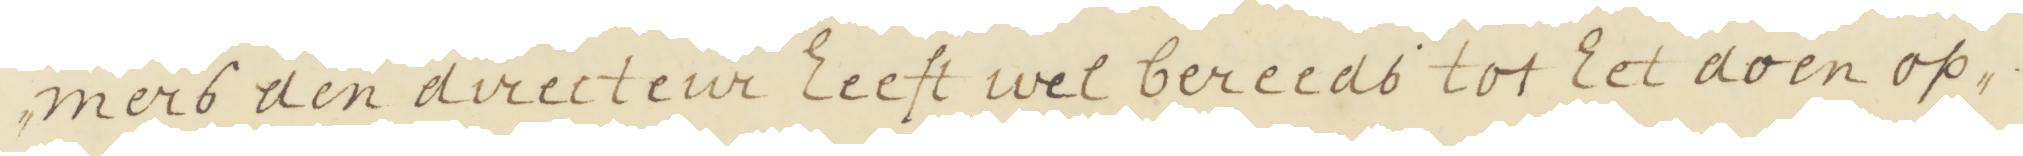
„mers den directeur heeft wel bereeds tot het doen op„
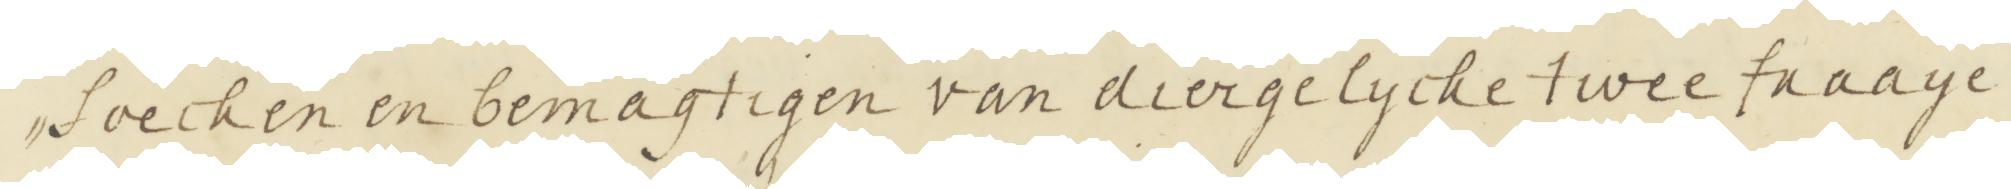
„soecken en bemagtigen van diergelijcke twee fraaije
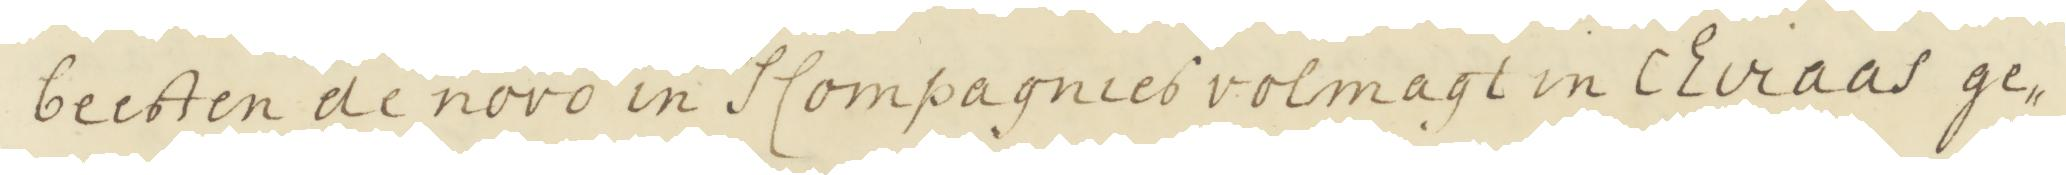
beesten de novo in ’s Compagnies volmagt in Chiraas ge„
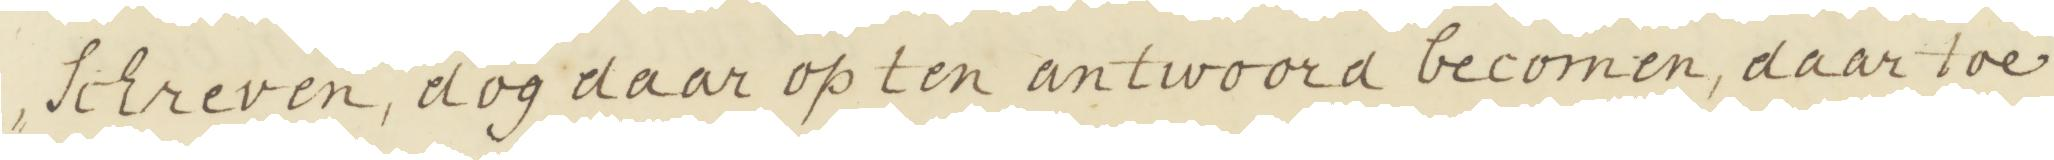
schreven, dog daar op ten antwoord becomen, daar toe
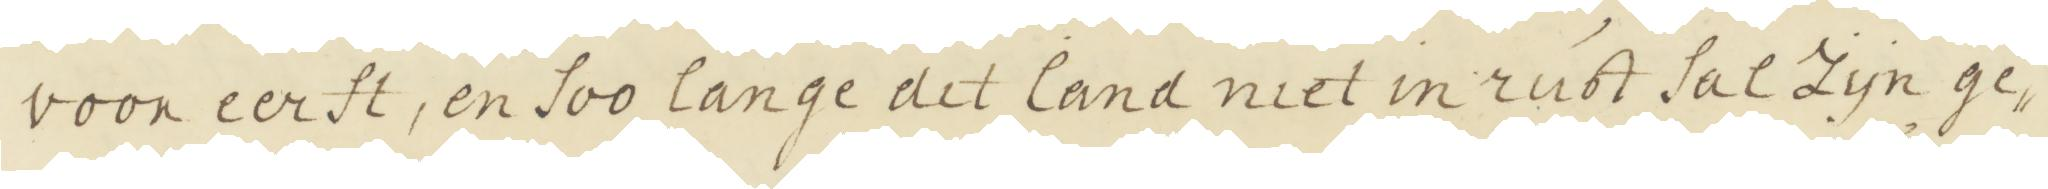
voor eerst, en soo lange dit land niet in rust sal zijn ge„
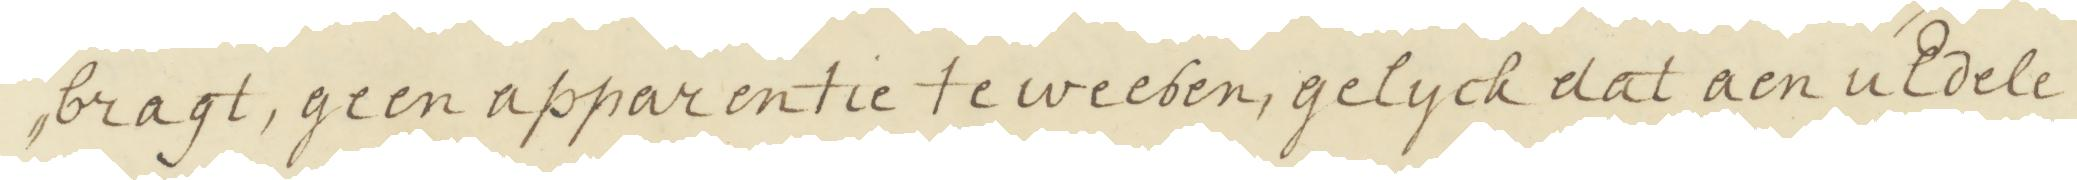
„bragt, geen apparentie te weesen, gelyck dat aen u Edele
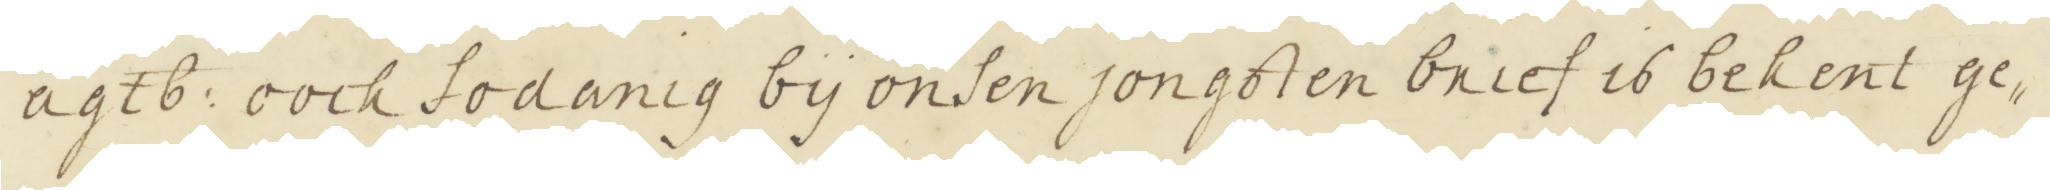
agtb: oock sodanig bij onsen jongsten brief is bekent ge„
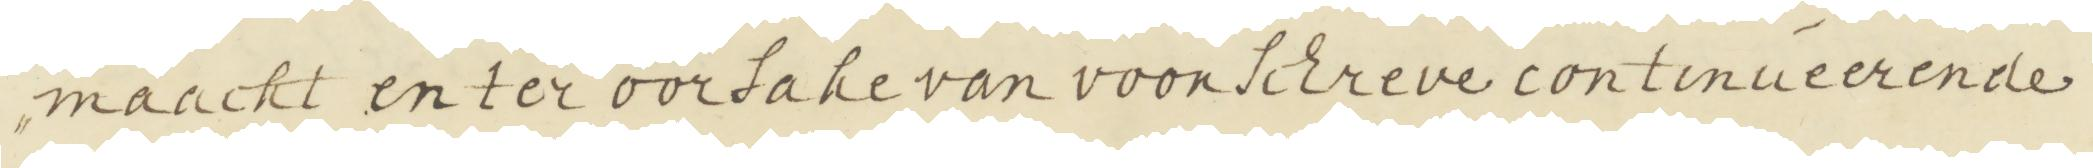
„maackt en ter oorsake van voorschreve continueerende
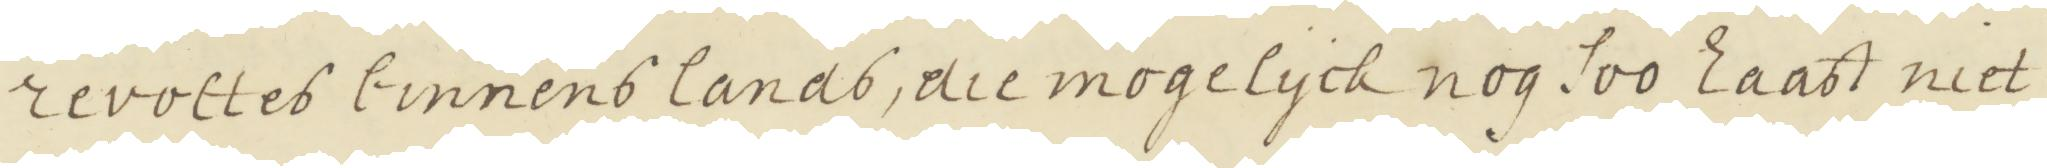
revoltes binnenslands, die mogelijck nog soo haast niet
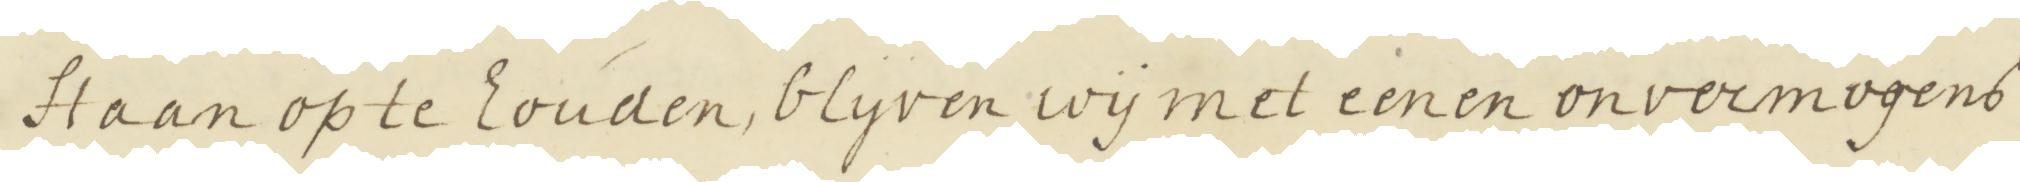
staan op te houden, blijven wij met eenen onvermogens
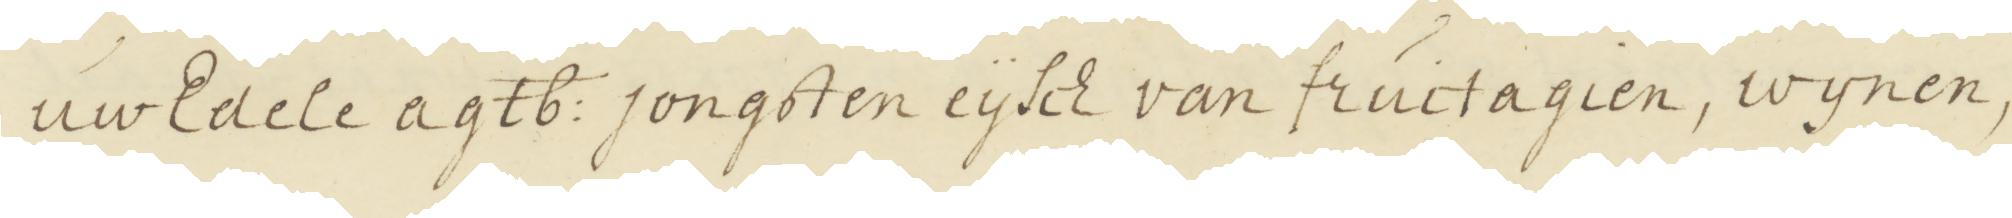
uw Edele agtb: jongsten eijsch van fruitagien, wynen,
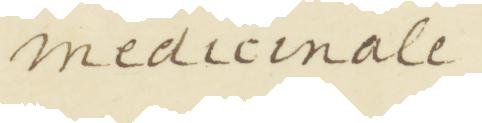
medicinale
